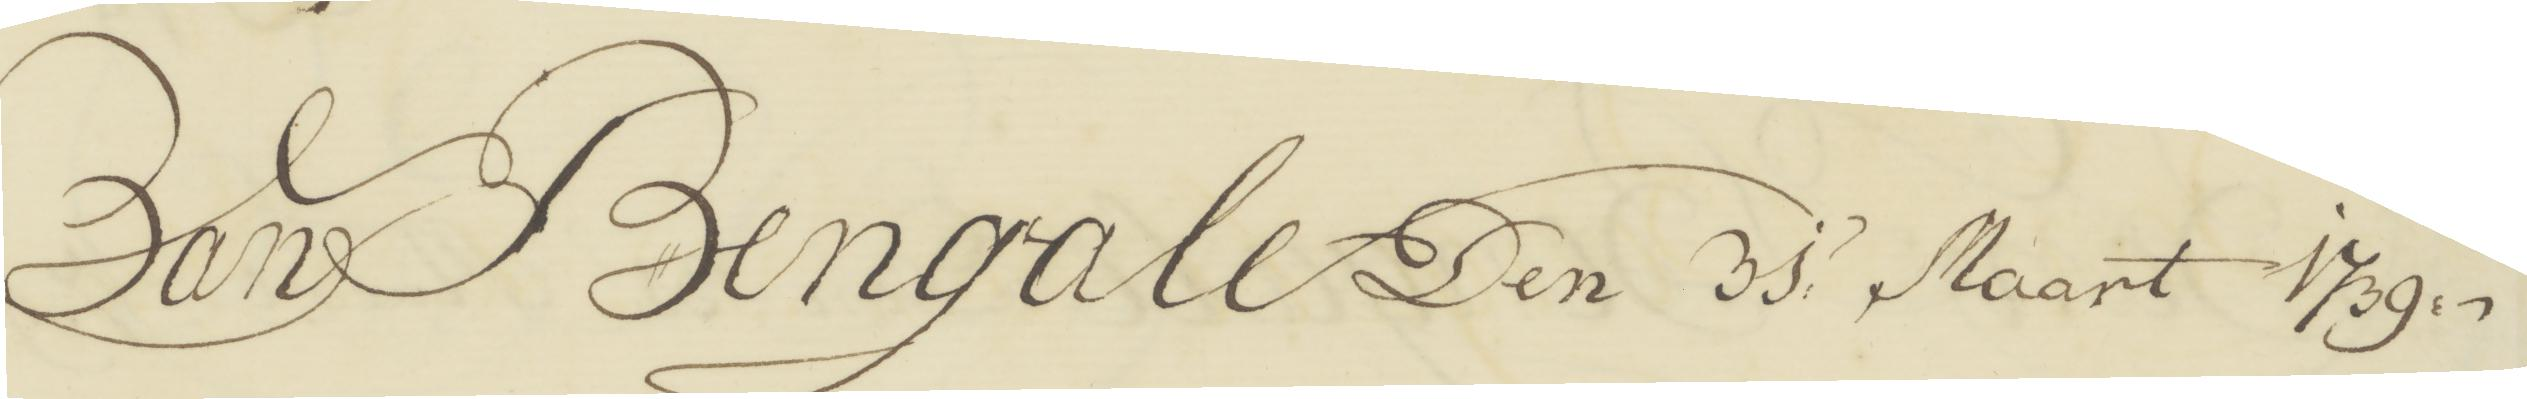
Van Bengale Den 31.' Maart 1739: -
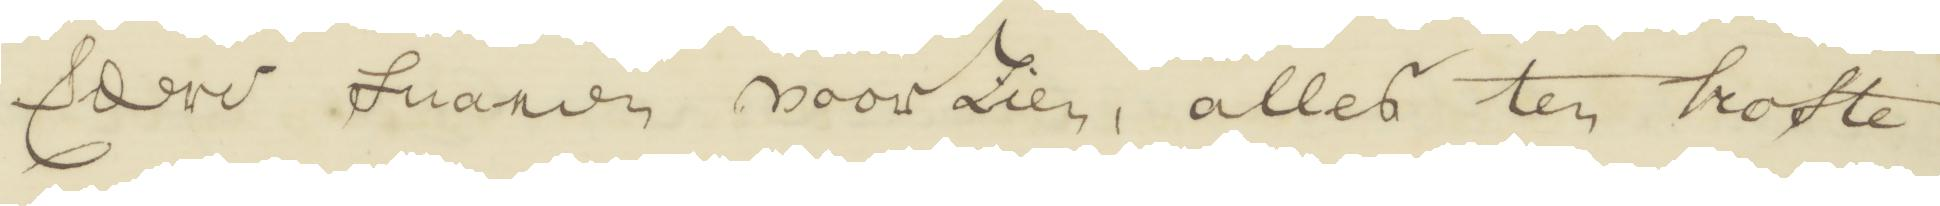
verdere snaren voorzien, alles ten koste
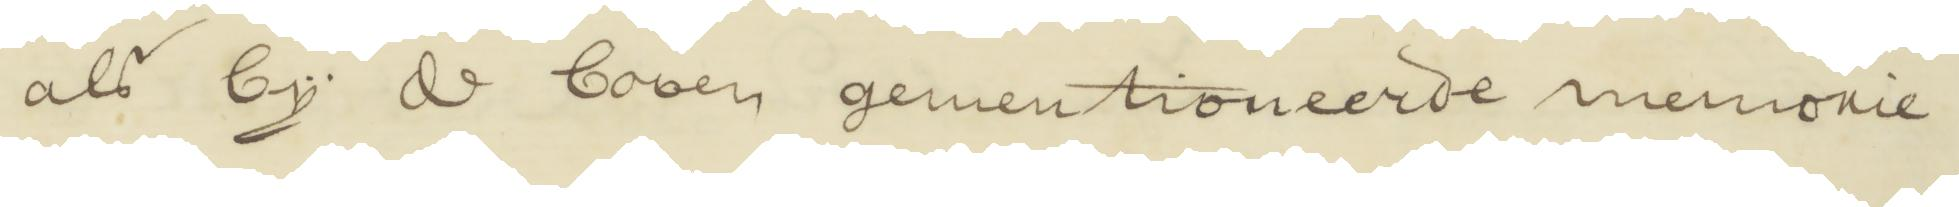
als bij de boven gementioneerde memorie
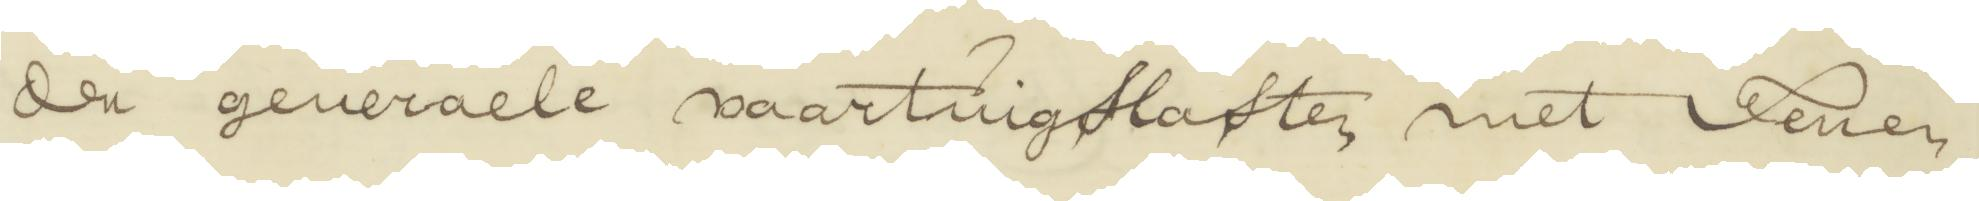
der generaele vaartuigslasten met Eenen
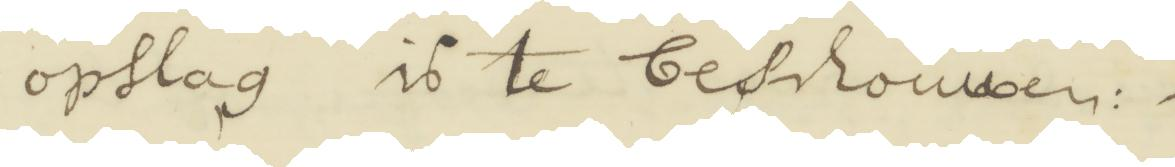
opslag is te beschouwen:
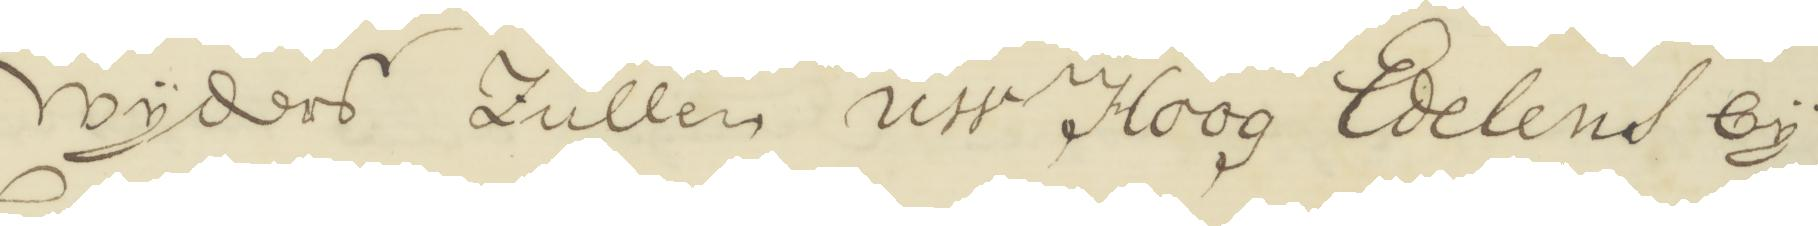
wijders zullen uw Hoog Edelens bij
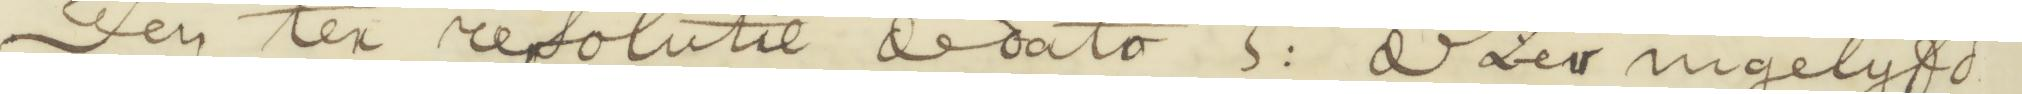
Een ter resolutie dedato 5: dezer ingelijfd
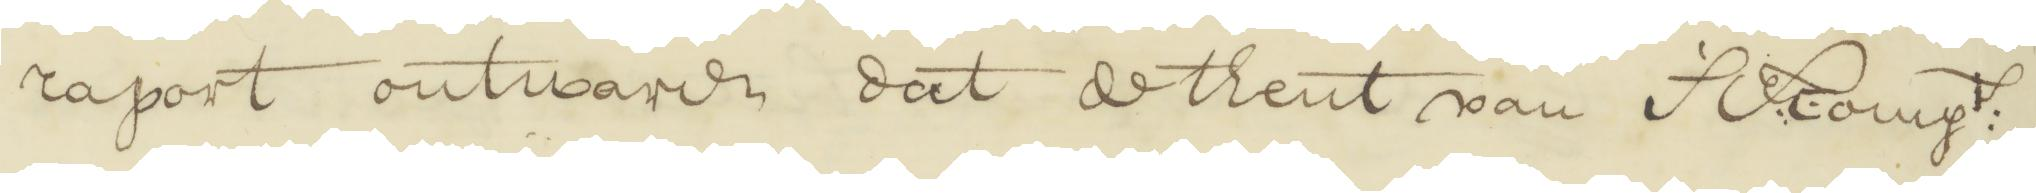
raport ontwaren dat dethent van sE:Comp:s
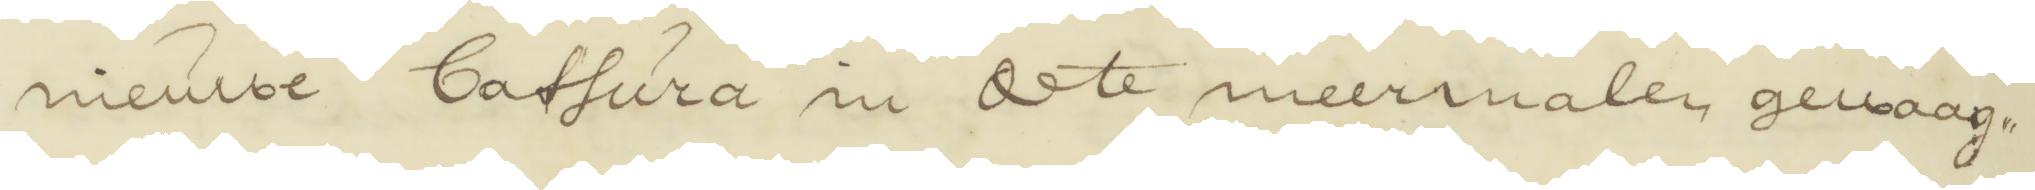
nieuwe bassura in dete meermalen gewaag„
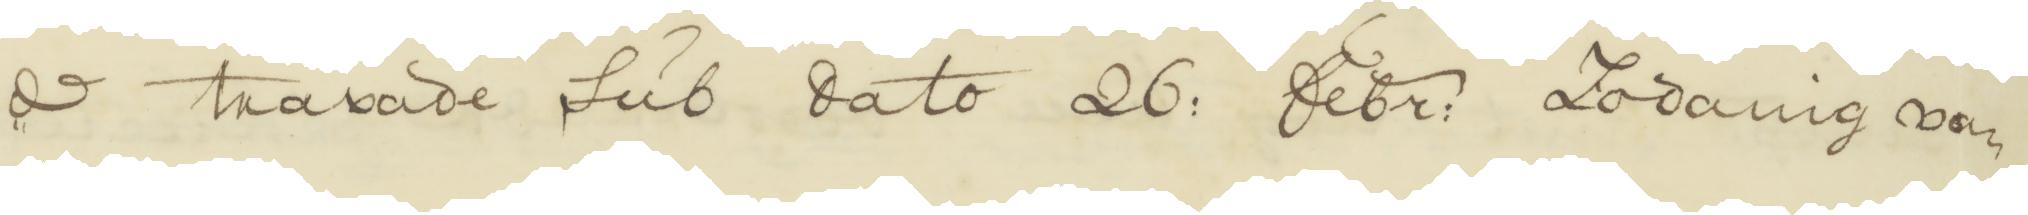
de travade sub dato 26: febr: zodanig van
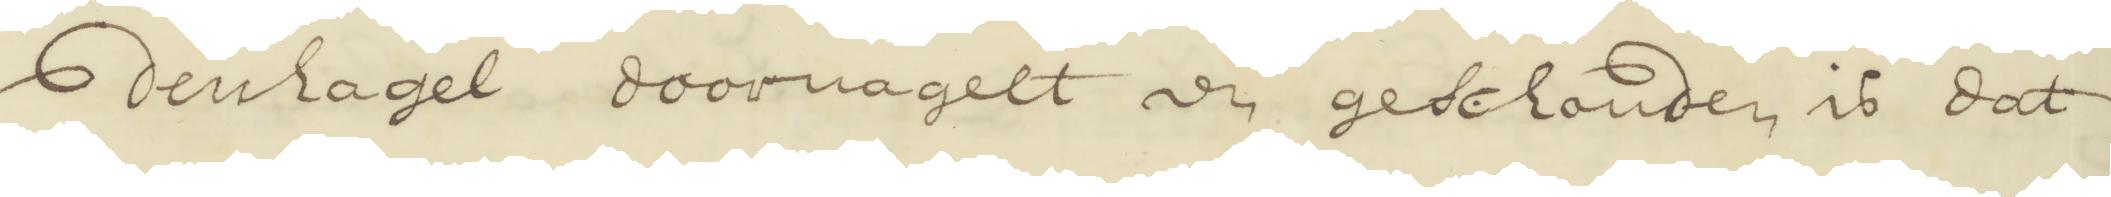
denhagel doornagelt en geschonden is dat
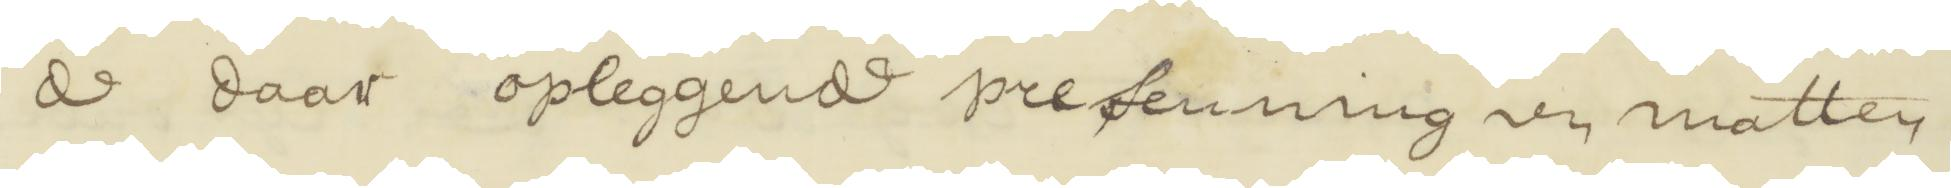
de daar opleggende presenning en matten
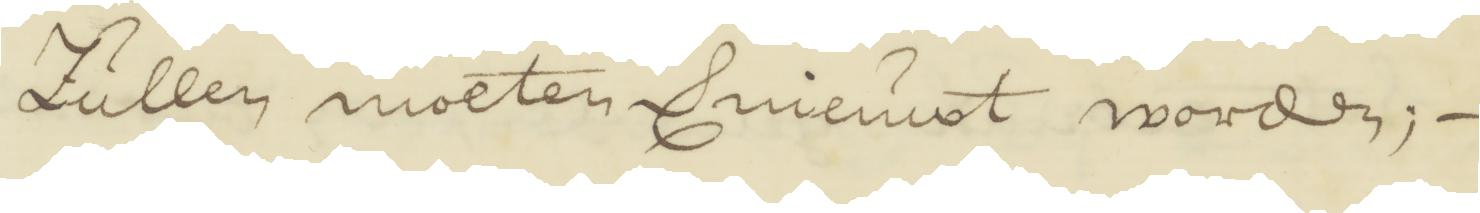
zullen moeten vernieuwt worden; —
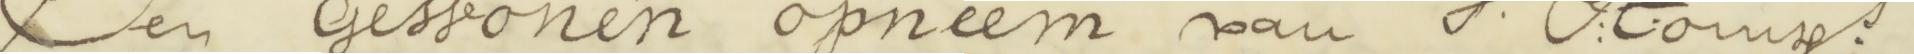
Den gewonen opneem van S: E:Comp:s
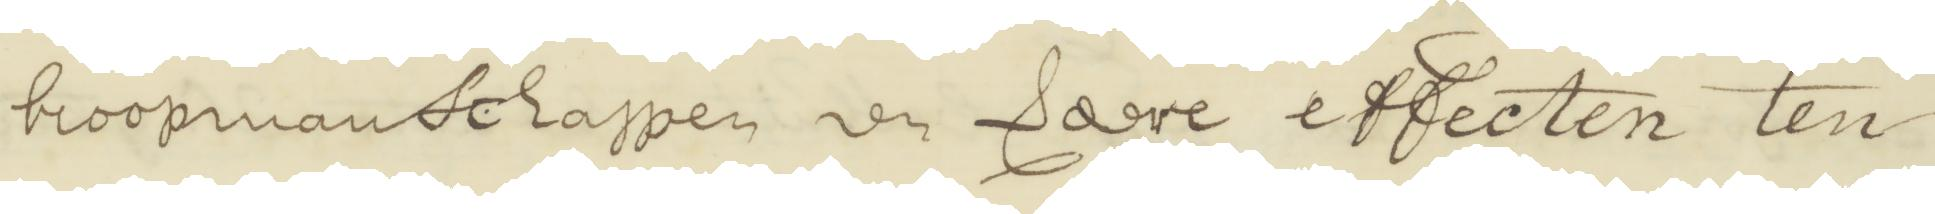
koopmanschappen en verdere effecten ten
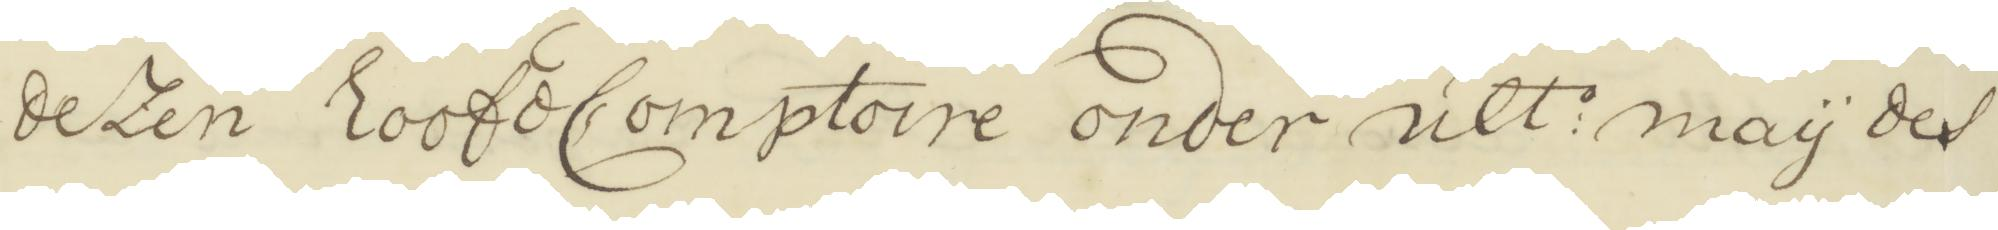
dezen hoofdcomptoire onder ult:o maij des
